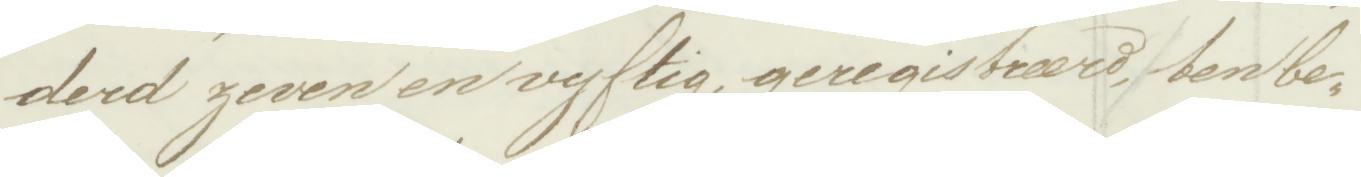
derd zeven en vyftig, geregistreerd, ten be„
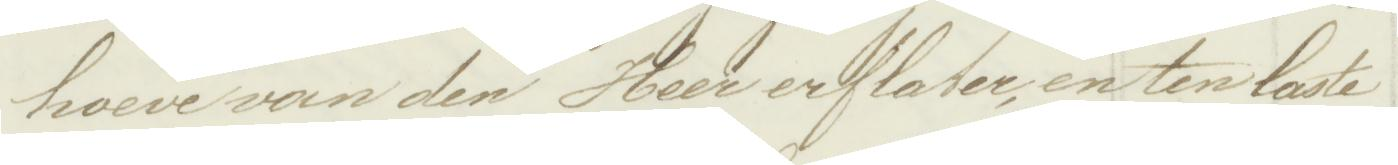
hoeve van den Heer erflater, en ten laste
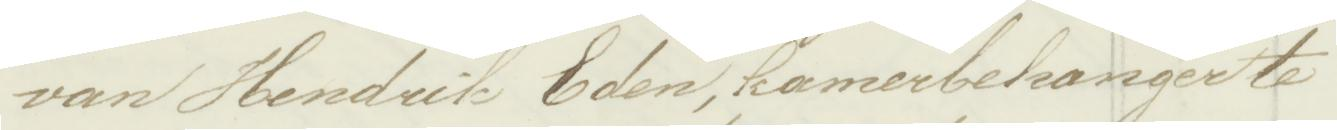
van Hendrik Eden, kamerbehanger te
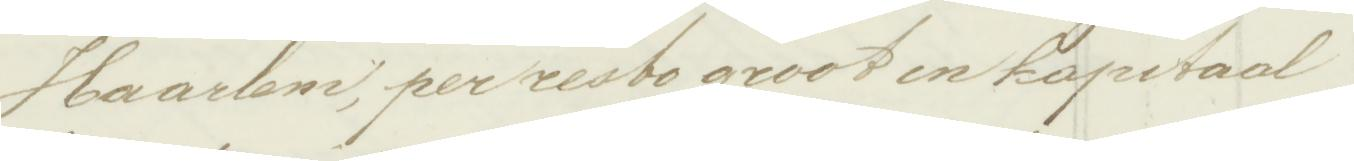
Haarlem, per resto groot in kapitaal
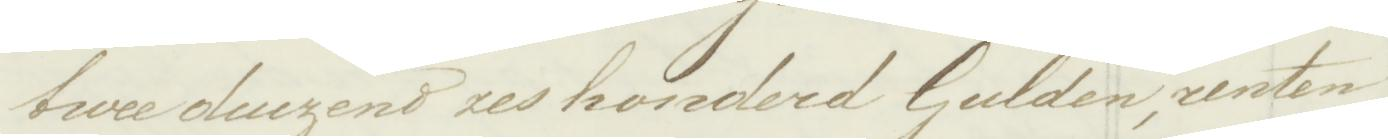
twee duizend zes honderd Gulden, renten
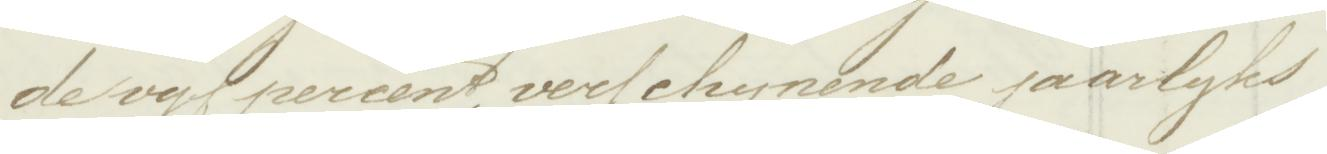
de vyf percent, verschynende jaarlyks
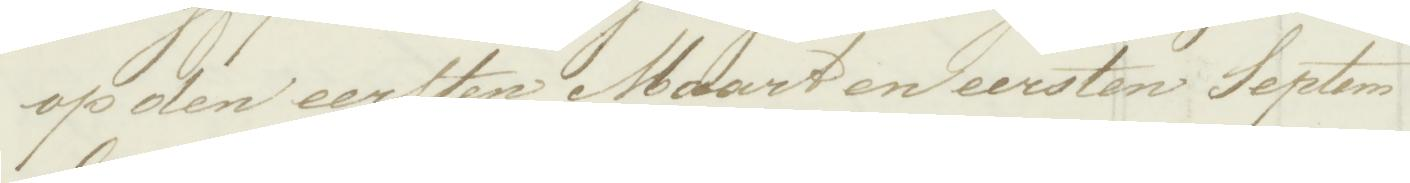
op den eersten Maart en eersten Septem
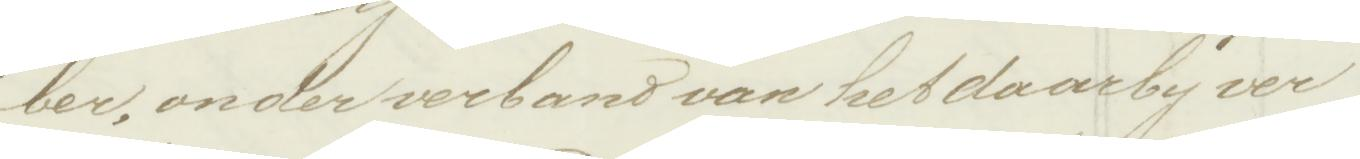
ber, onder verband van het daarby ver
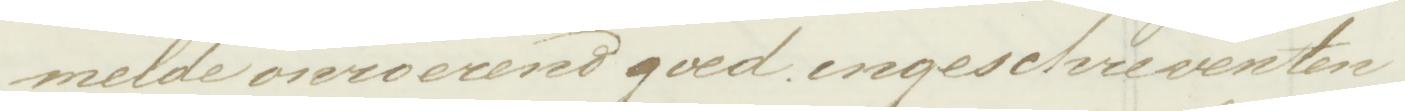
melde onroerend goed ingeschreven ten
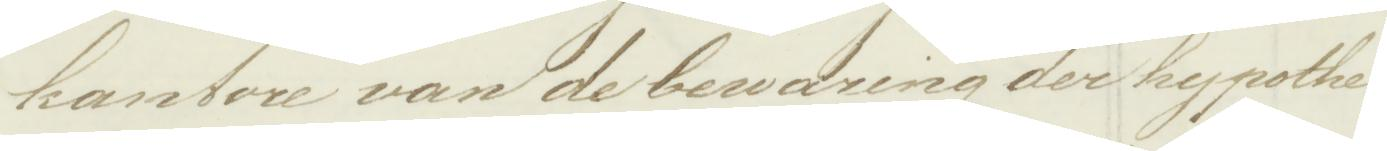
kantore van de bewaring der hypothe
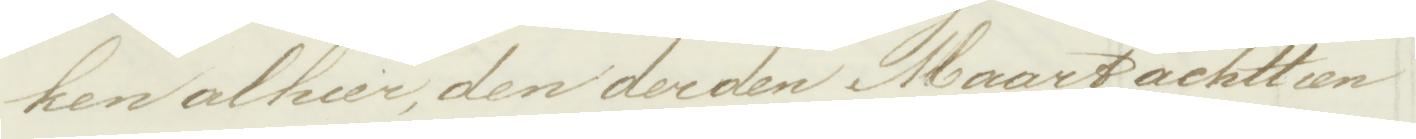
ken alhier, den derden Maart achttien
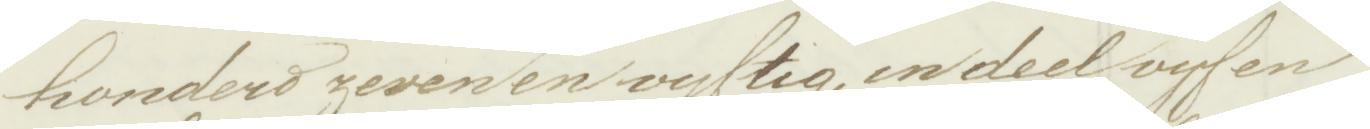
honderd zeven en vyftig, in deel vyf en
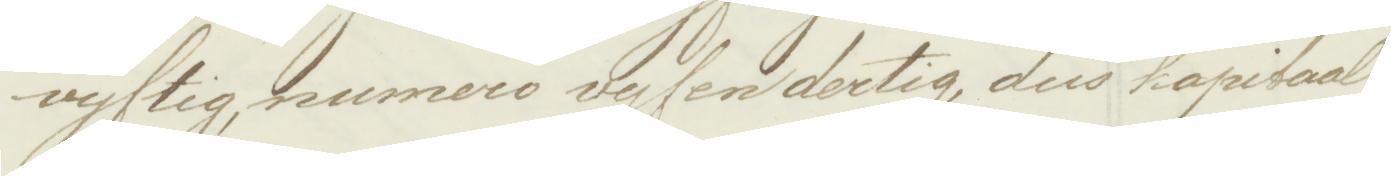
vyftig, numero vyf en dertig, dus kapitaal
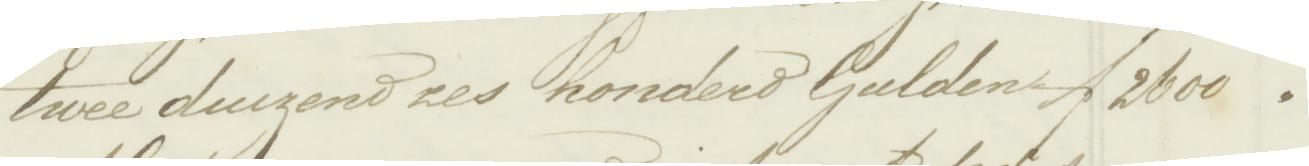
twee duizend zes honderd Gulden— ƒ 2600 „
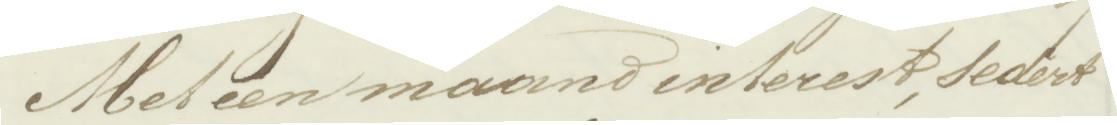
Met een maand interest, sedert
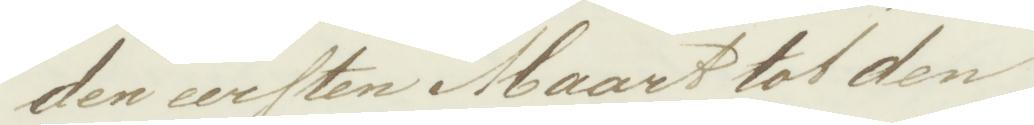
den eersten Maart tot den
